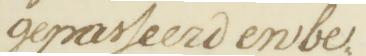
gepasseerd en be.
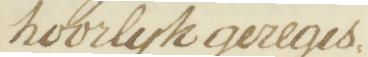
hoorlyk geregis
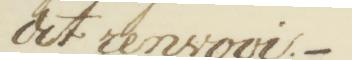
dit renvooi.-
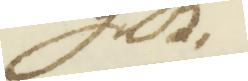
J.B.
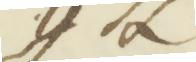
Y Z
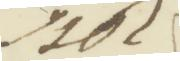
HR
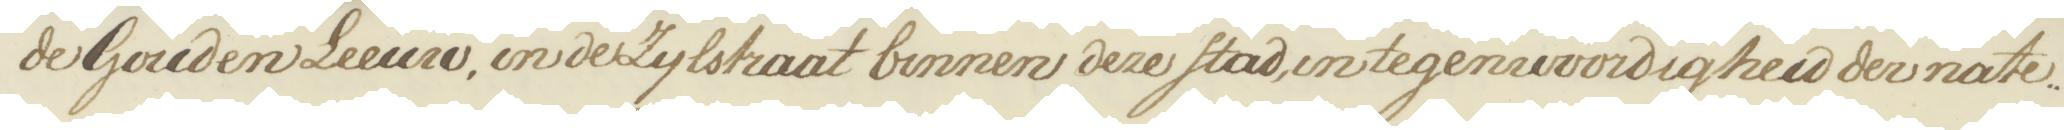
de Gouden Leeuw, in de Zylstraat binnen deze stad, in tegenwoordigheid der nate„
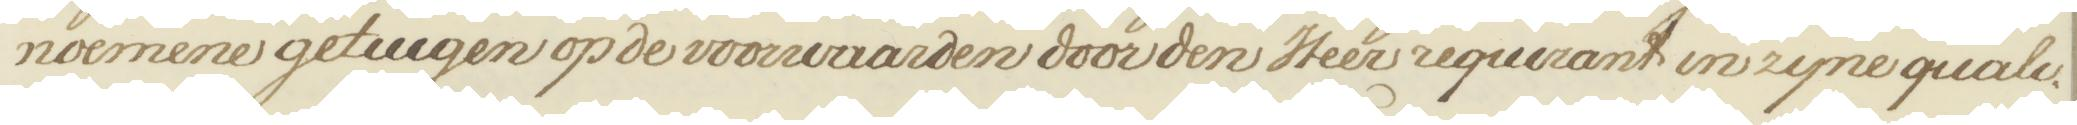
noemene getuigen op de voorwaarden door den Heer requirant in zyne quali„
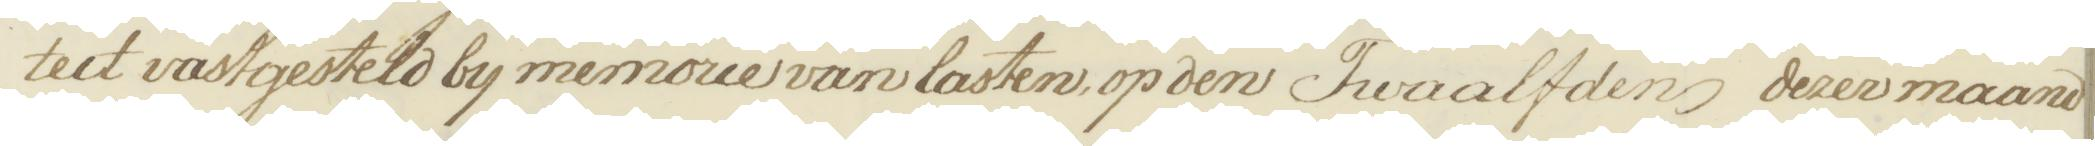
teit vastgesteld by memorie van lasten, op den Twaalfden dezer maand
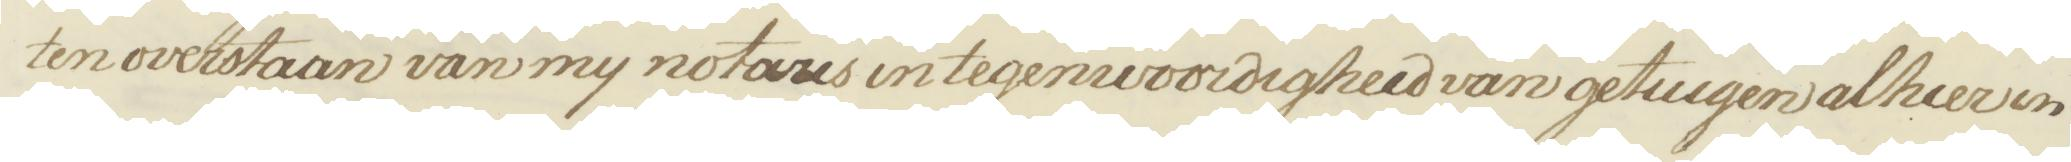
ten overstaan van my notaris in tegenwoordigheid van getuigen alhier in
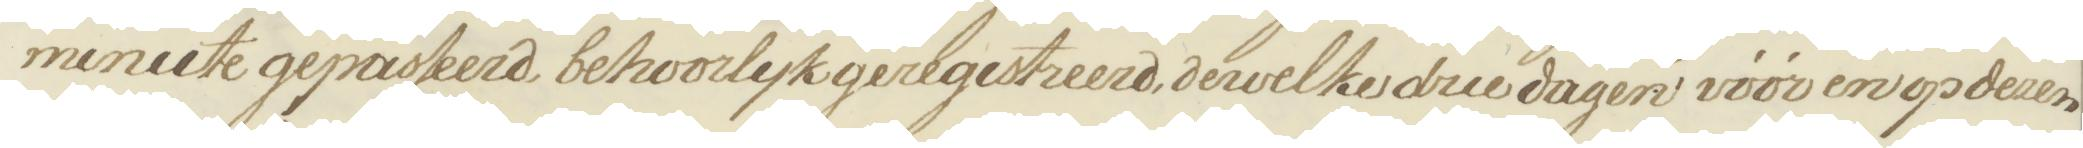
minute gepasseerd, behoorlyk geregistreerd, dewelke drie dagen vóór en op dezen
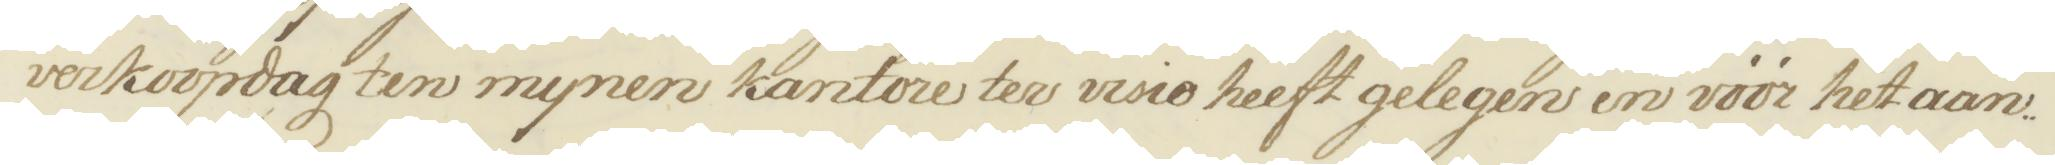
verkoopdag ten mynen kantore ter visio heeft gelegen en vóór het aan„
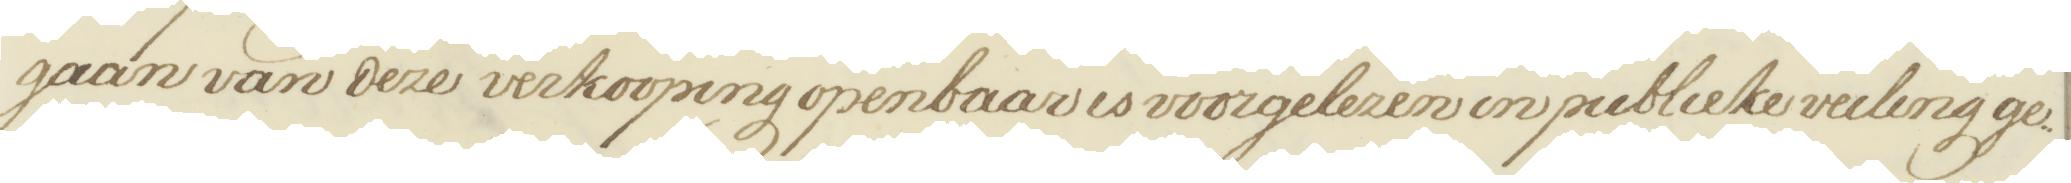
gaan van deze verkooping openbaar is voorgelezen in publieke veiling ge„
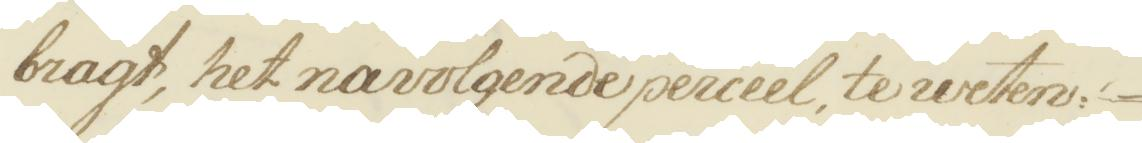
bragt, het navolgende perceel, te weten:
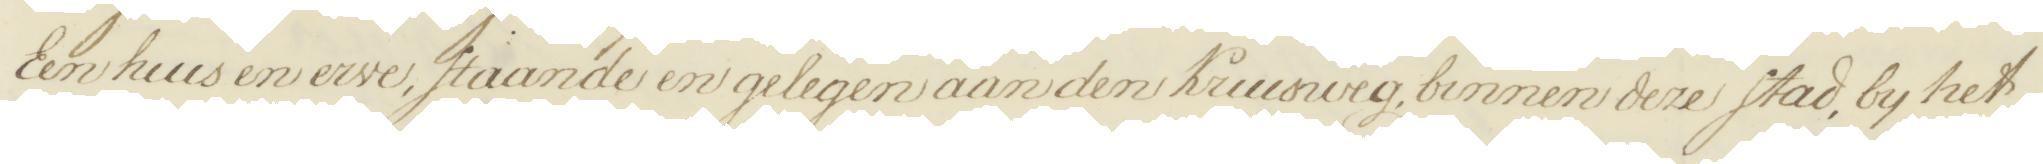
Een huis en erve, Staande en gelegen aan den Kruisweg, binnen deze Stad, by het
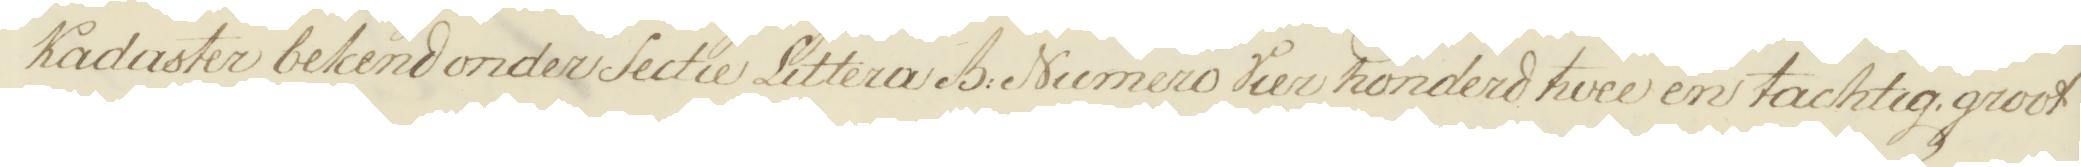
Kadaster bekend onder Sectie Littera B: Numero Vier honderd twee en tachtig, groot
